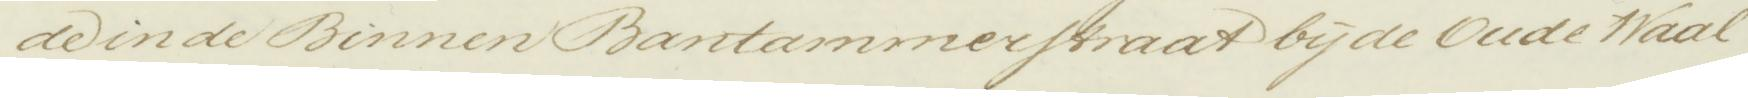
de in de Binnen Bantammerstraat bij de Oude Waal
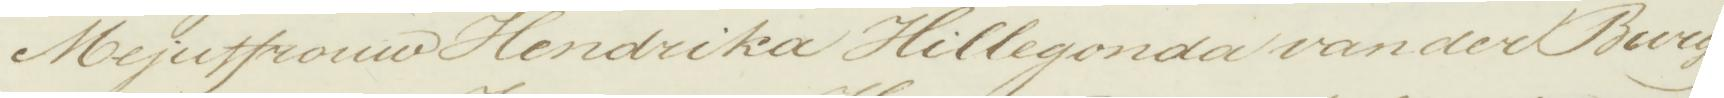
Mejuffrouw Hendrika Hillegonda van der Burg,
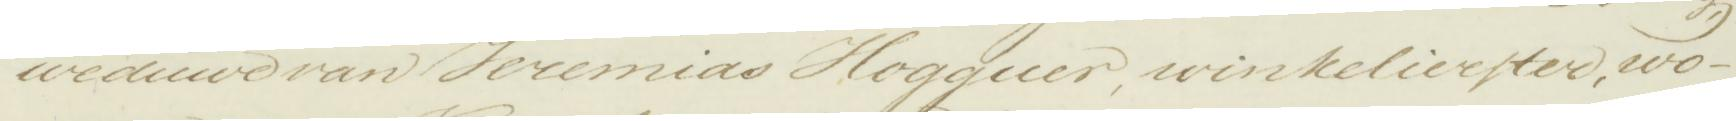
weduwe van Ieremias Hogguer, winkelierster, wo-
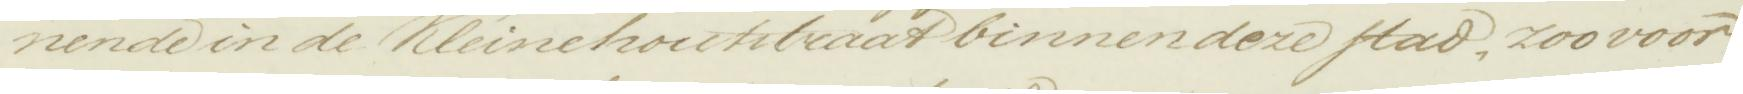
nende in de Kleinehoutstraat binnen deze stad, zoo voor
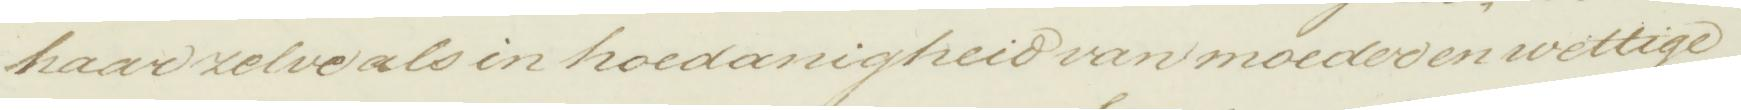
haar zelve als in hoedanigheid van moeder en wettige
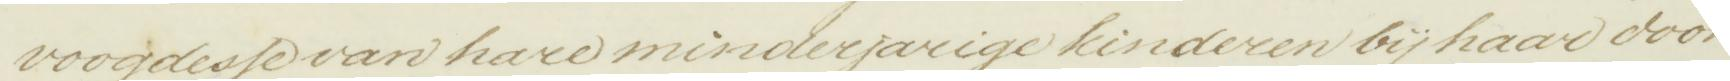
voogdesse van hare minderjarige kinderen bij haar door
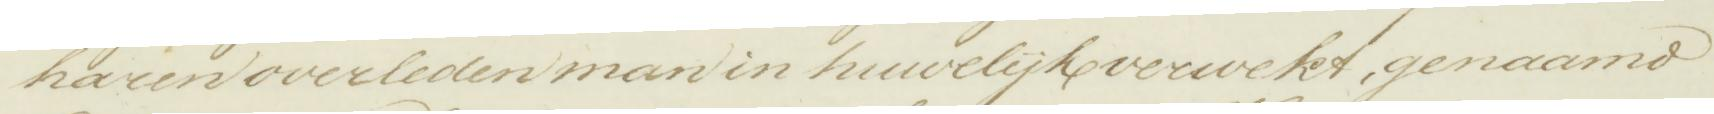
haren overleden man in huwelijk verwekt, genaamd
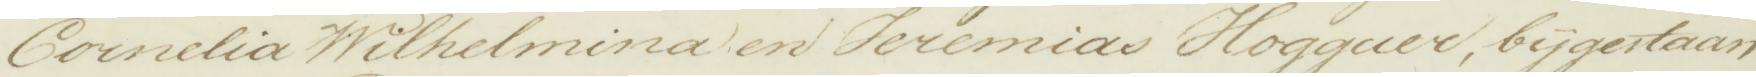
Cornelia Wilhelmina en Ieremias Hogguer, bijgestaan
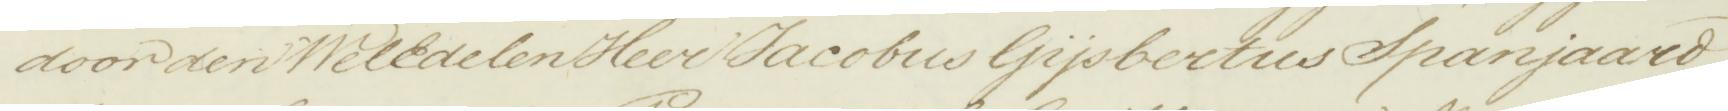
door den WelEdelen Heer Iacobus Gijsbertus Spanjaard,
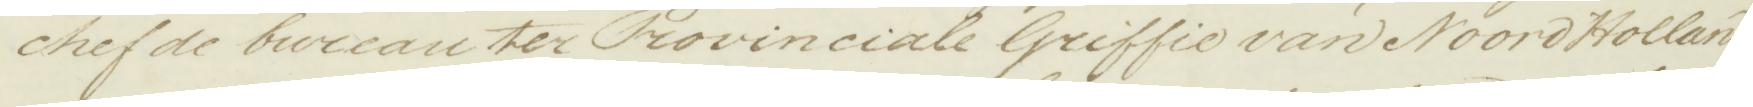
chef de bureau ter Provinciale Griffie van Noord Holland,
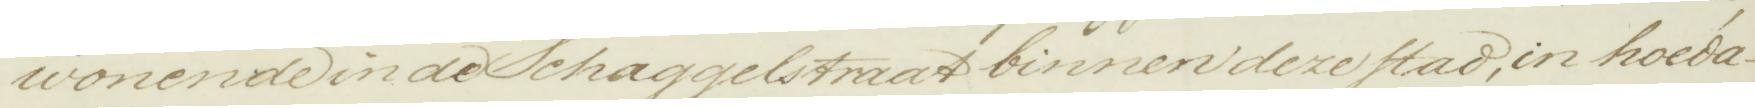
wonende in de Schaggelstraat binnen deze stad, in hoeda
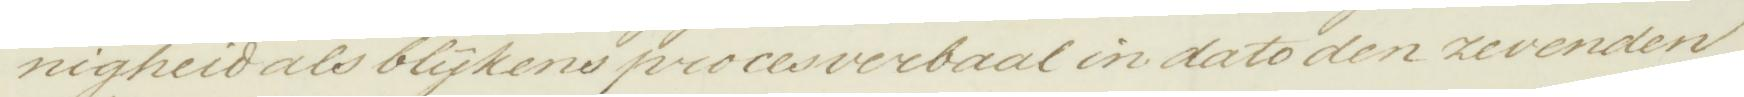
nigheid als blijkens procesverbaal in dato den zevenden
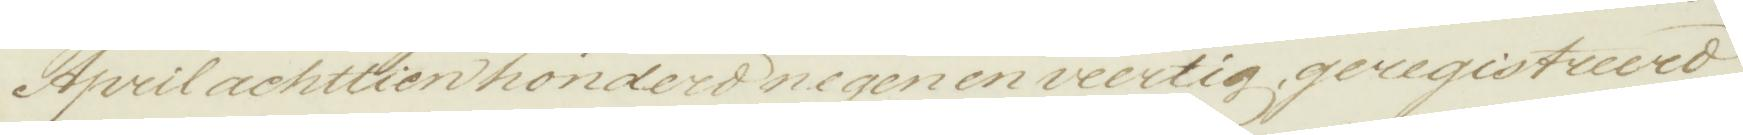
April achttien honderd negen en veertig, geregistreerd,
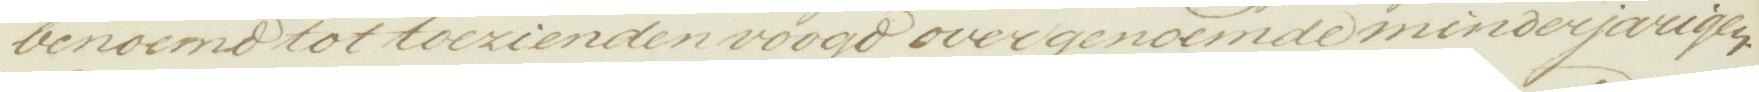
benoemd tot toezienden voogd over genoemde minderjarigen
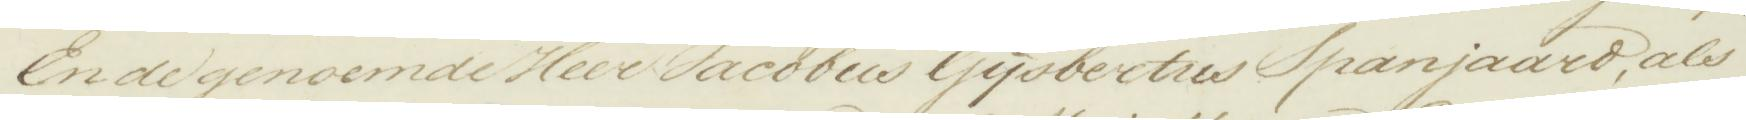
En de genoemde Heer Iacobus Gijsbertus Spanjaard, als
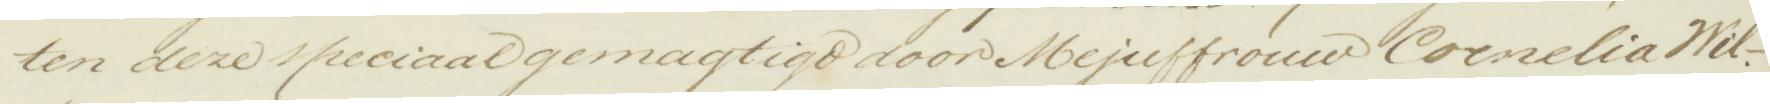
ten deze speciaal gemagtigd door Mejuffrouw Cornelia Wil„
